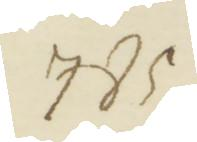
785
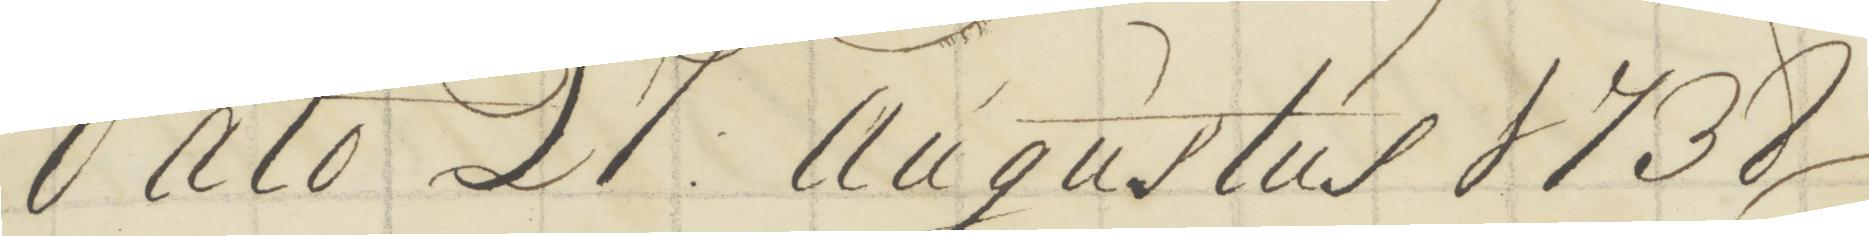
dato 27: Augustus 1738
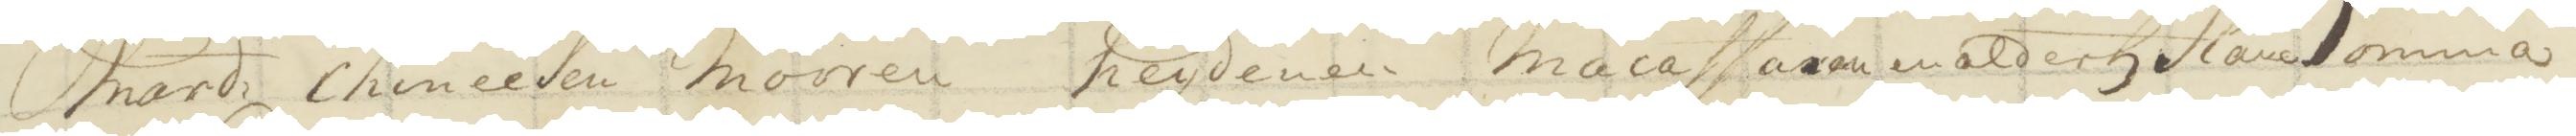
Mard: chineesen mooren heydenen Macassaren en alderh Slave Somma
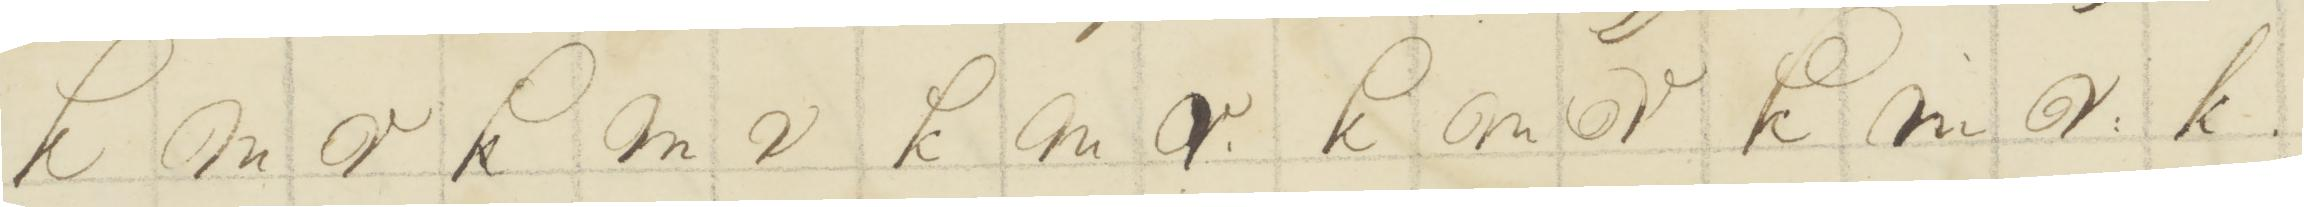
k m v k m v k m v k m v k m v: k.
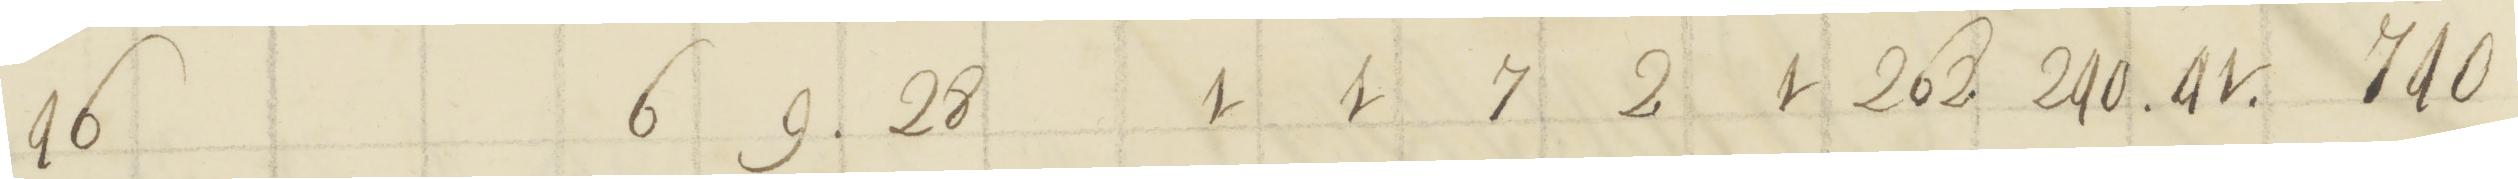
46 6 9. 28 1 1 7 2 1 262. 240. 41. 740
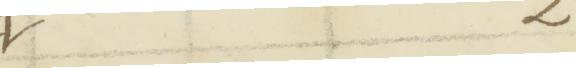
1 2
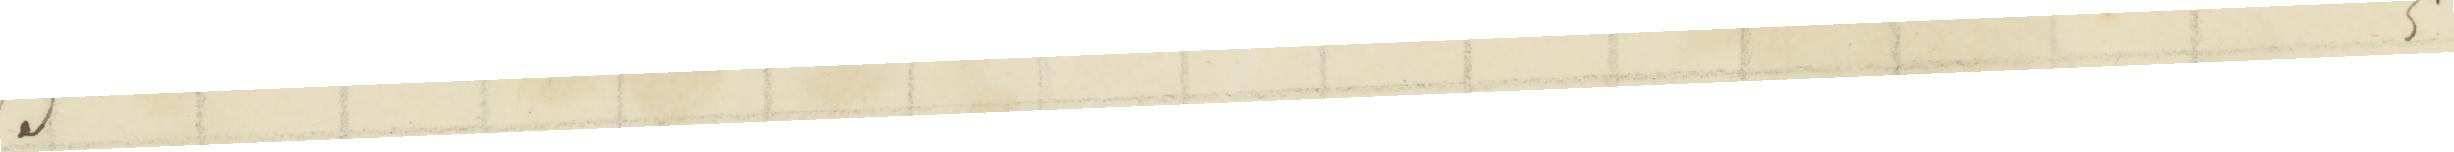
3 5
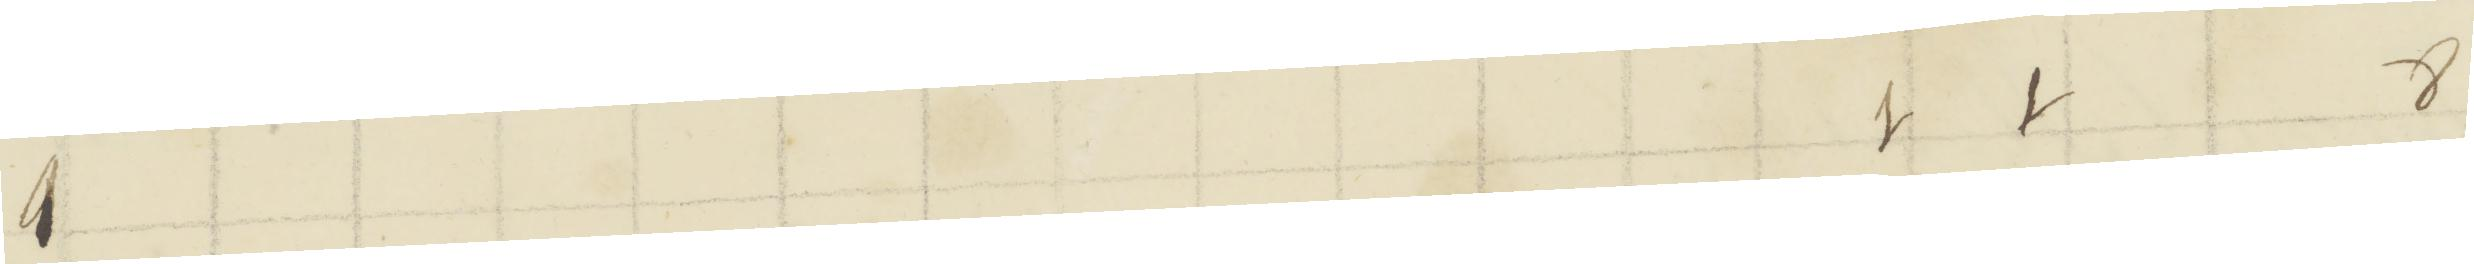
4 1 1 8
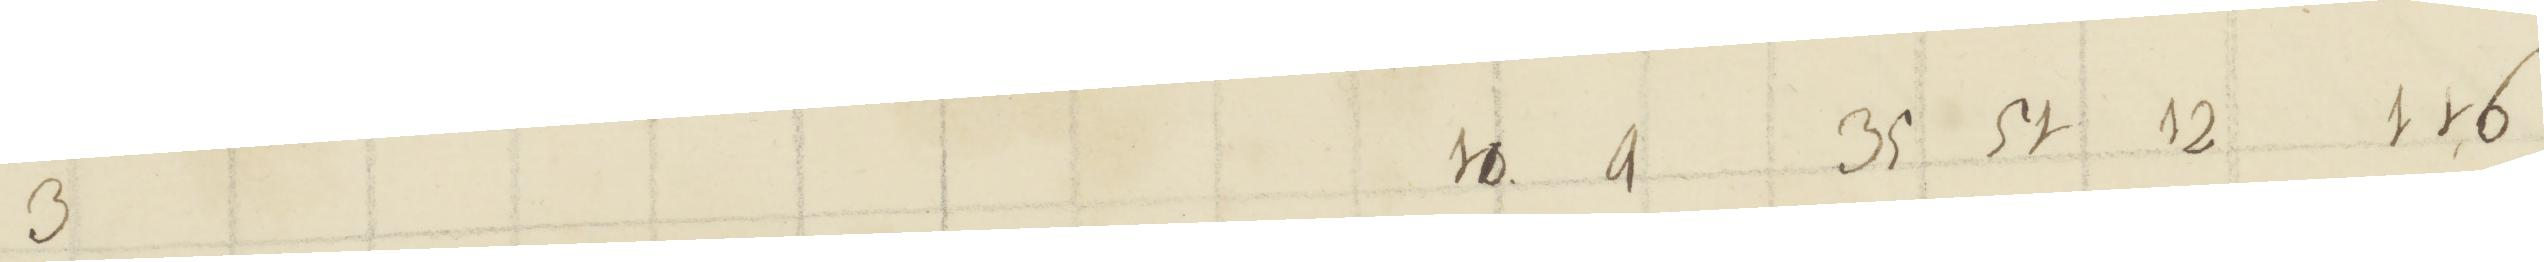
3 10. 4 35 51 12 116
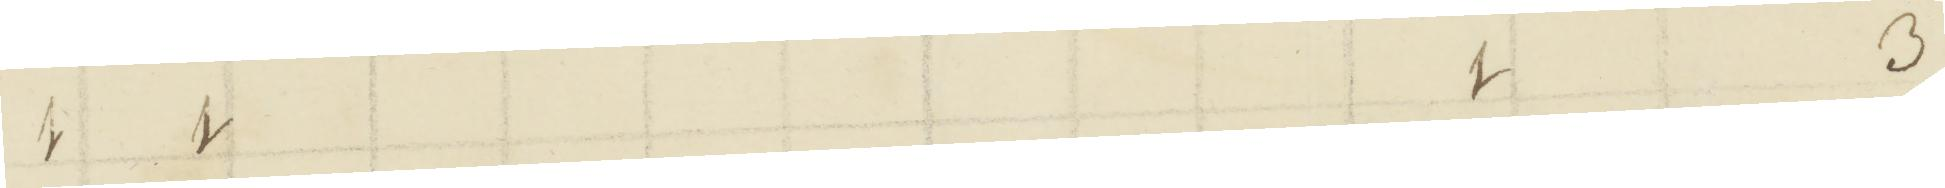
1 1 1 3
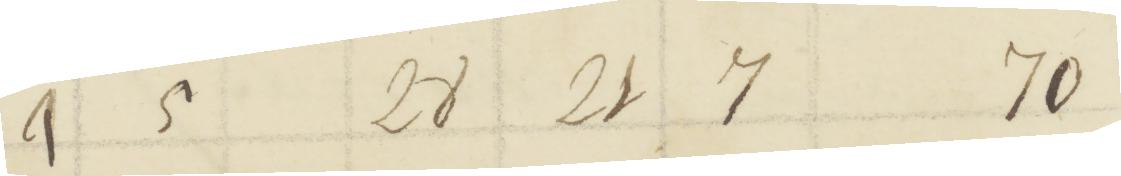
4 5 28 21 7 70
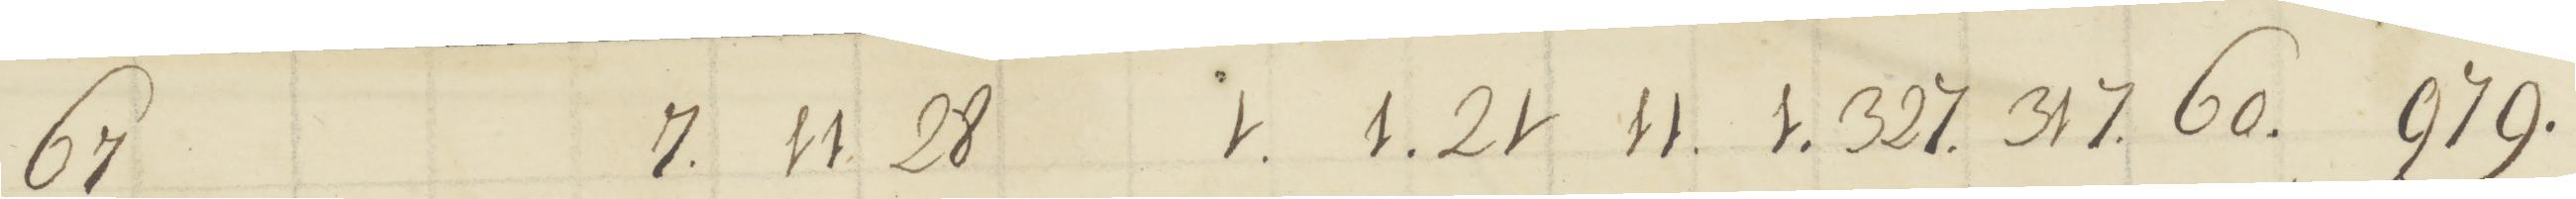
67 7. 11: 28 1. 1. 21 11. 1. 327. 317. 60. 979.
